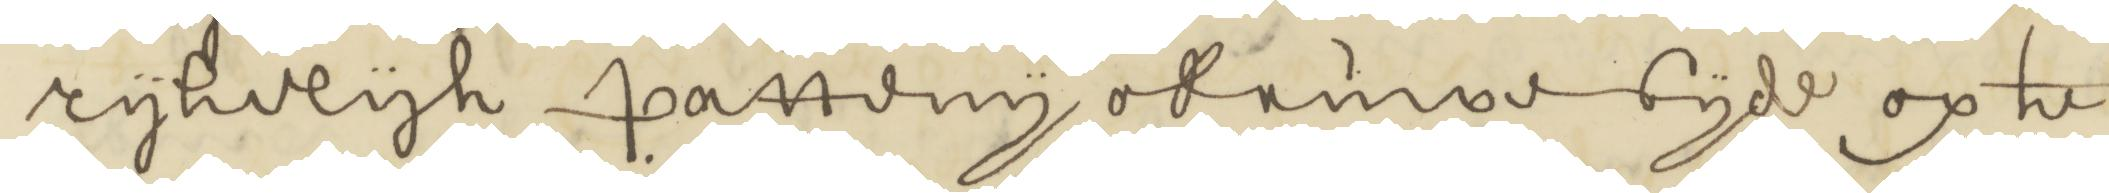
rijkelijk pattenij of ruwe sijde op te
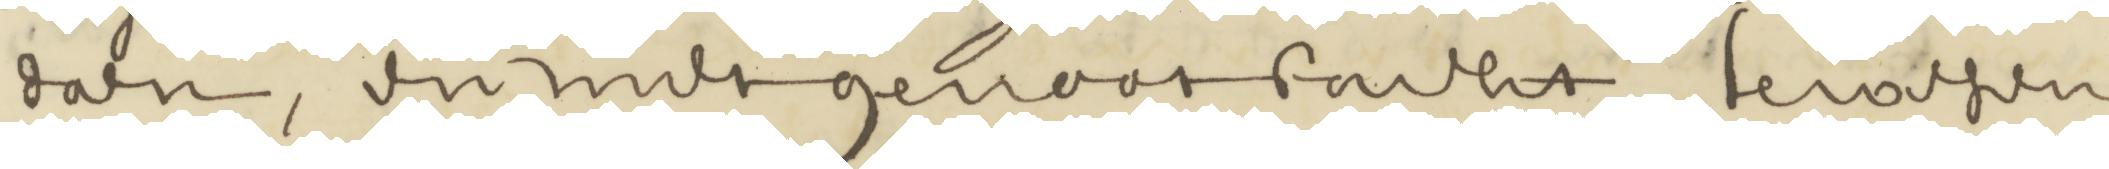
doen, en niet genootsaekt te wesen
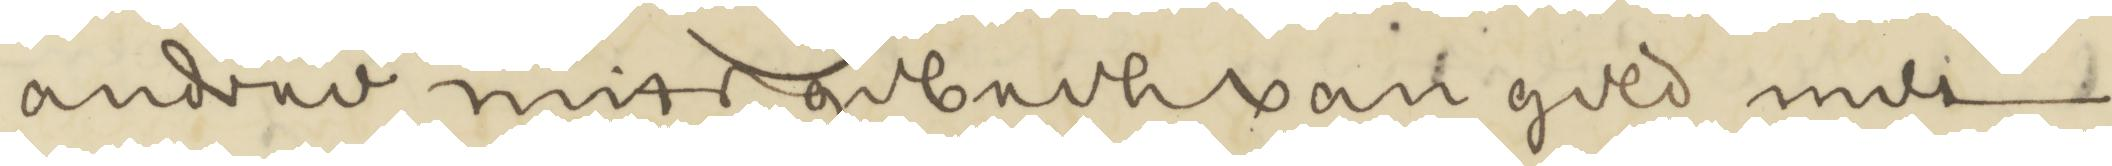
andere mits gebrek van geld met
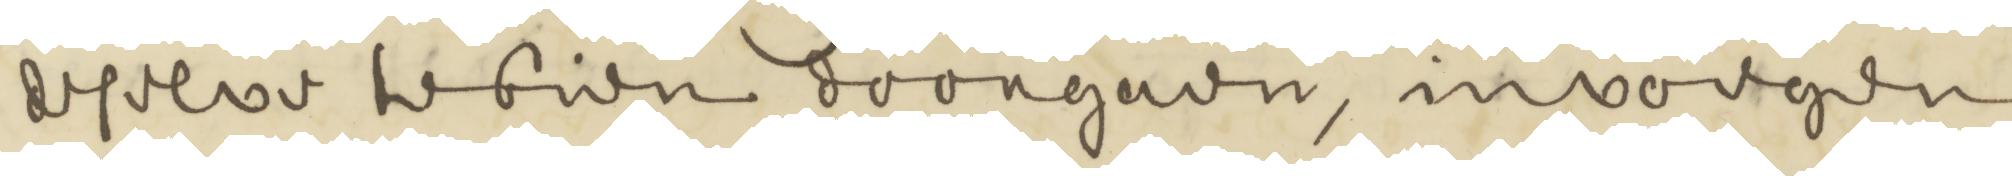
deselve te sien doorgaen, invoegen
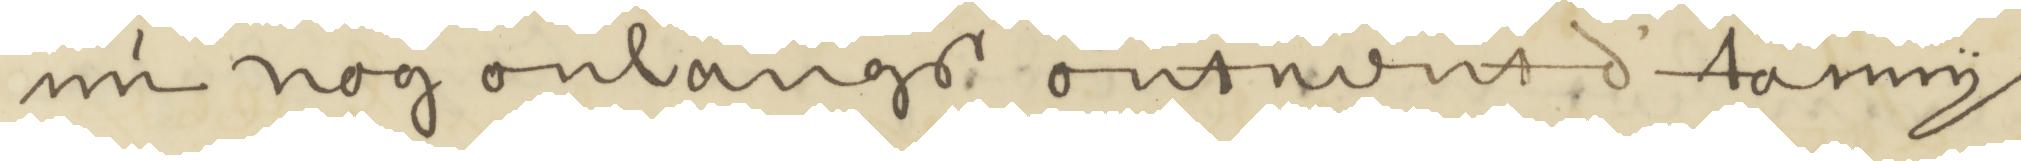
nu nog onlangs ontrent d' tannij
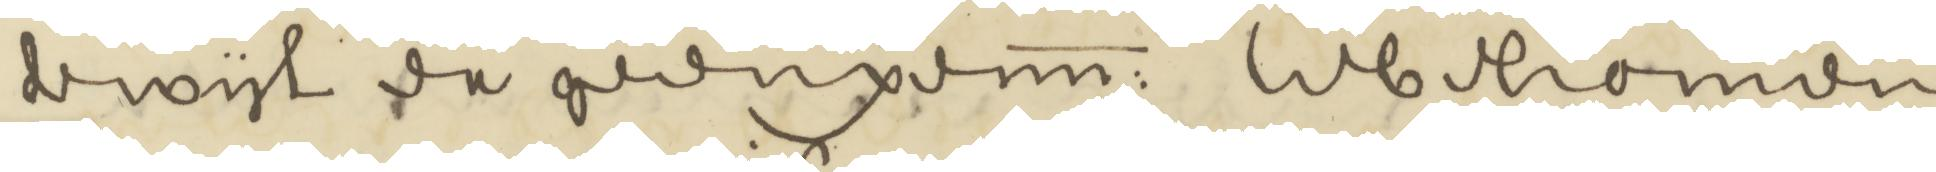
dewijl er geen penn: te bekomen
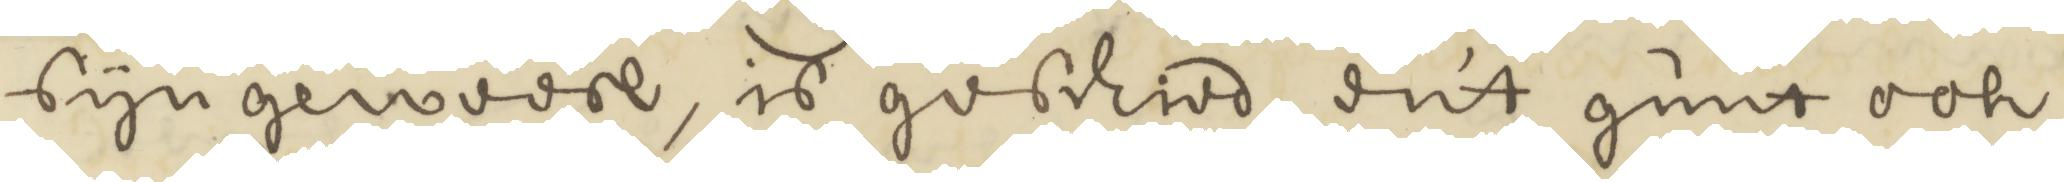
sijn geweest, is geschied, en 't gunt ook
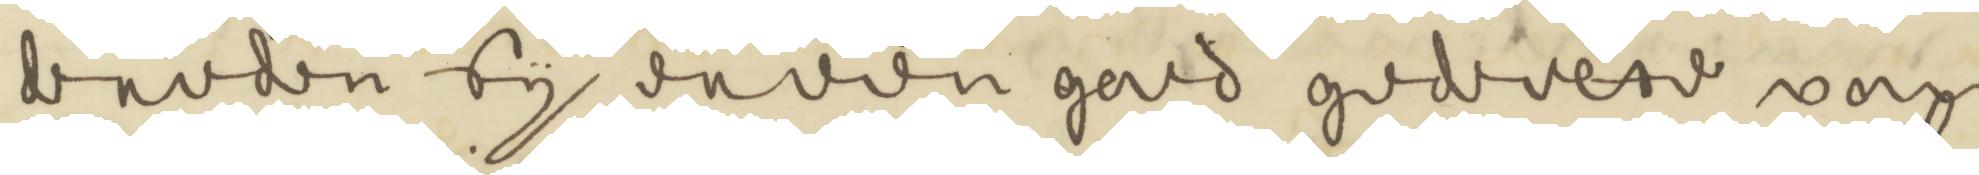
de reden sij er een goed gedeelte van
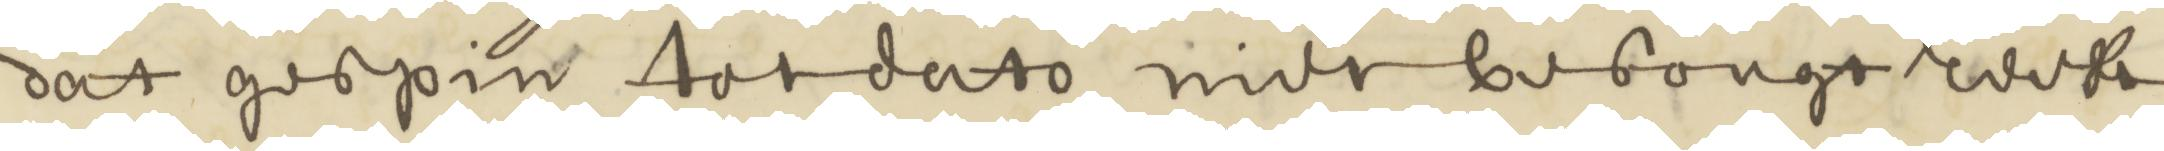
dat gespin tot dato niet besorgt heeft
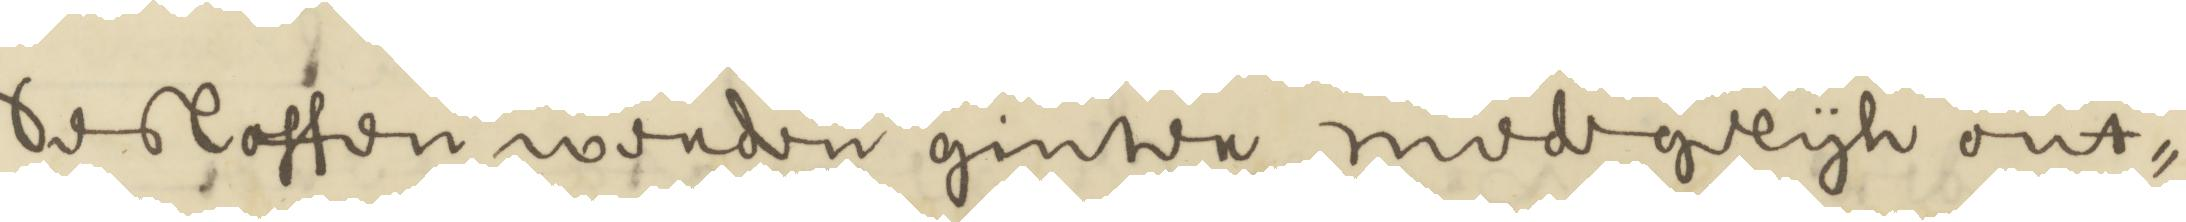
de stoffen werden ginter mede gelijk ont„
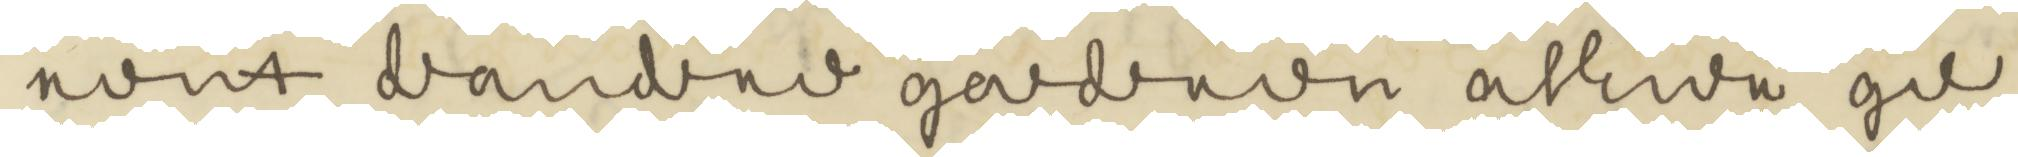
rent de andere goederen alhier ge
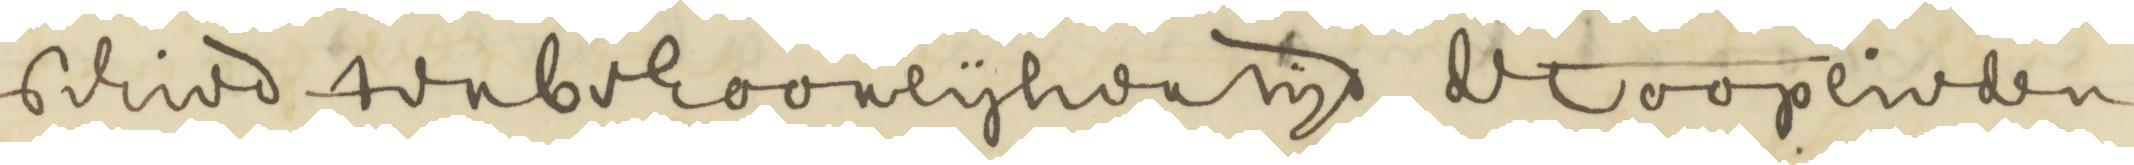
schied ter behoorlijker tijd de Cooplieden
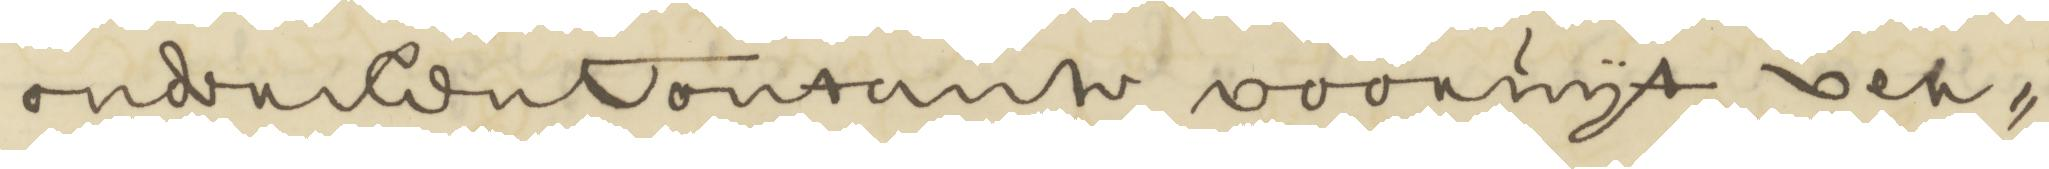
onder Een Contante vooruijt ver„
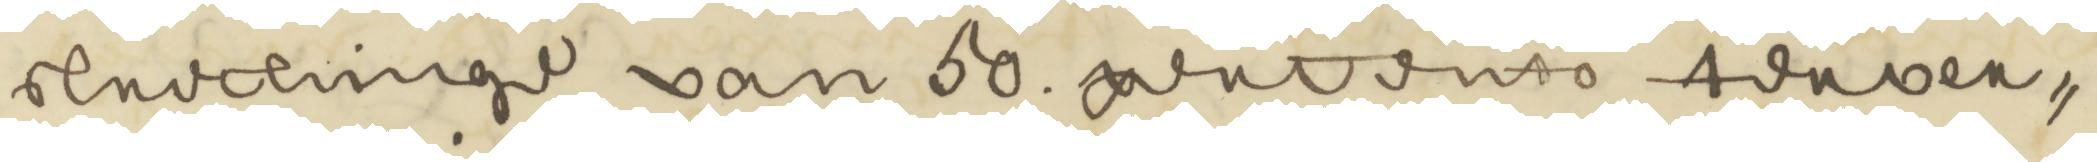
streckinge van 50. percento ter ver„
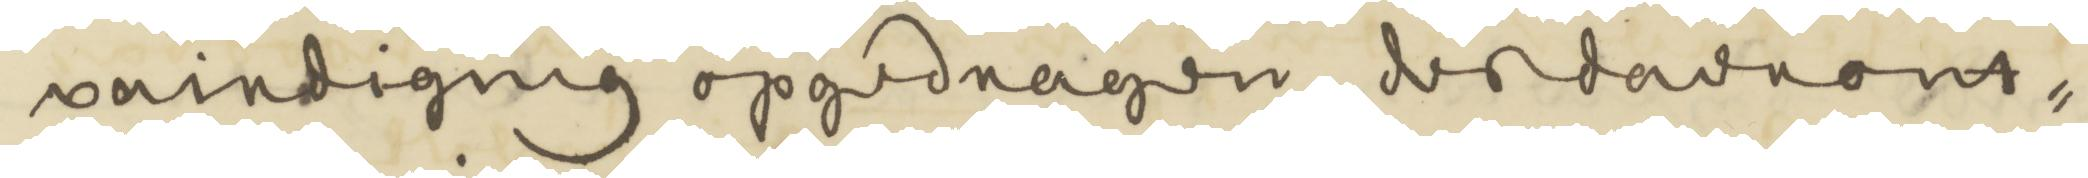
vairdiging opgedragen, des daer ont„
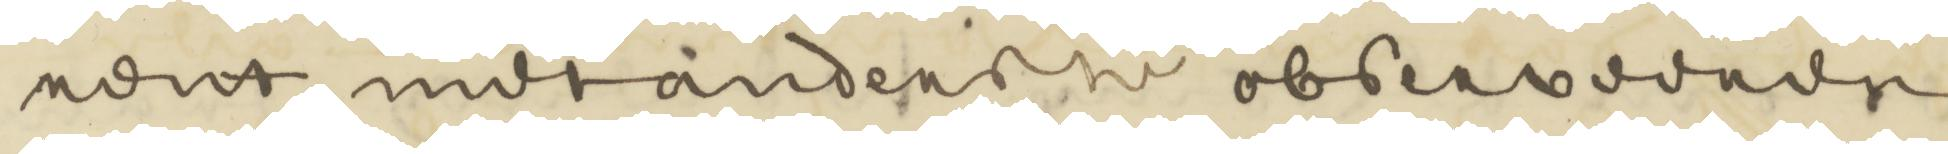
rent niet anders te observeeren
